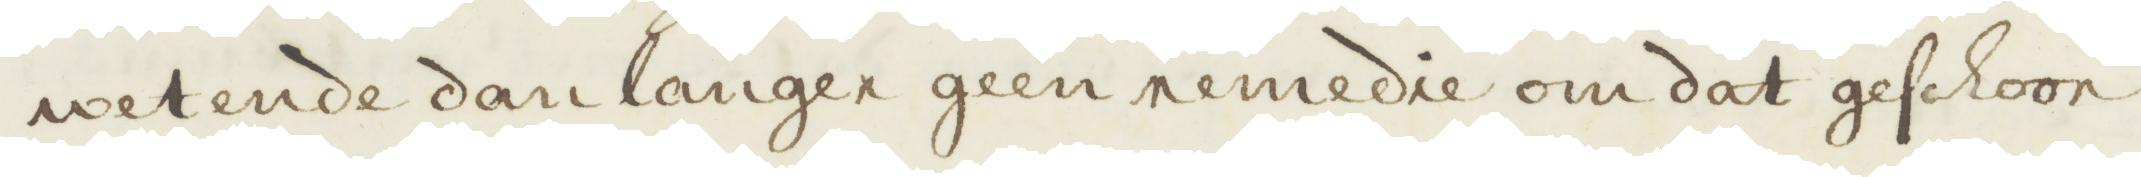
wetende dan langer geen remedie om dat geschoor
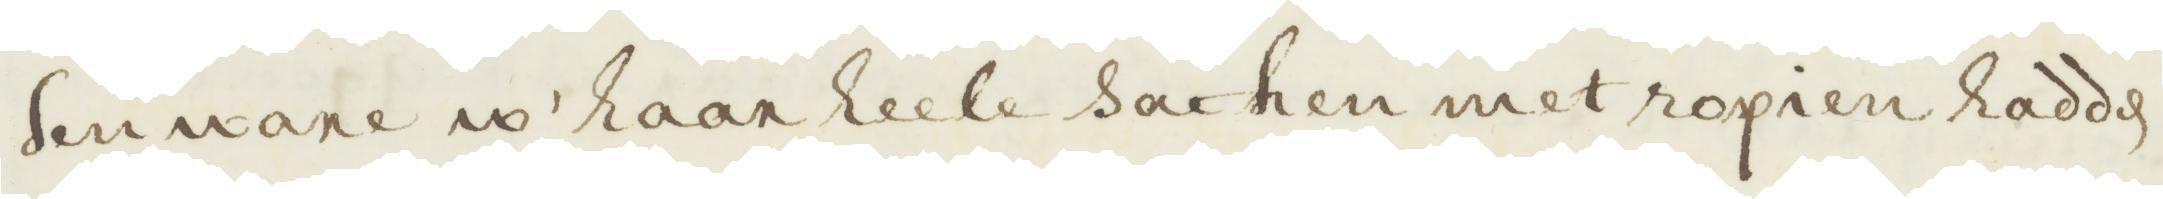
ten ware w' haar heele sacken met ropien hadden
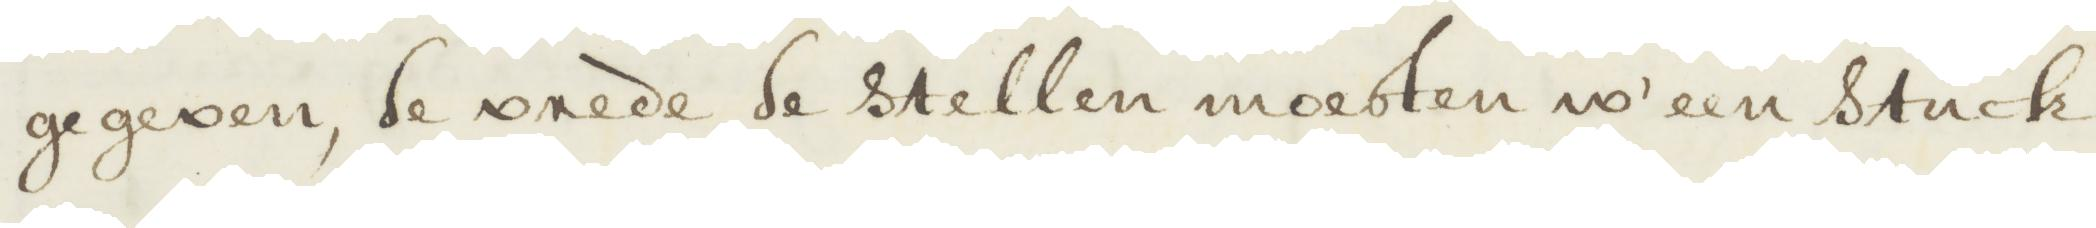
gegeven, te vrede te stellen moesten w' een stuck
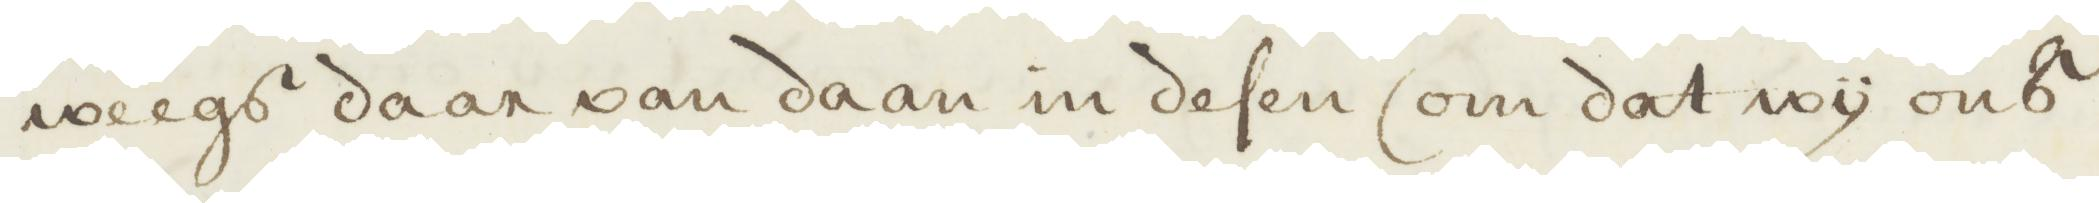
weegs daar van daan in desen (om dat wij ons
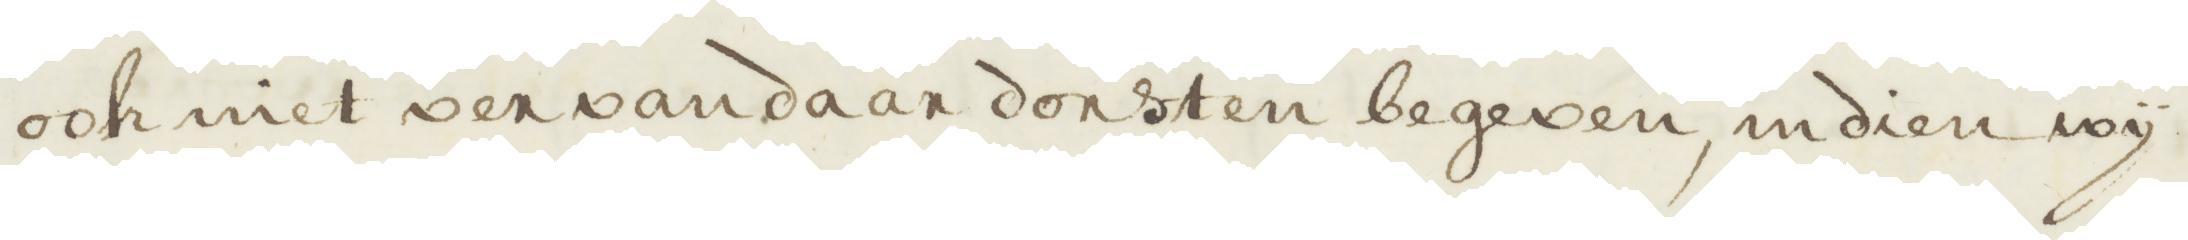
ook niet ver van daar dorsten begeven, in dien wij
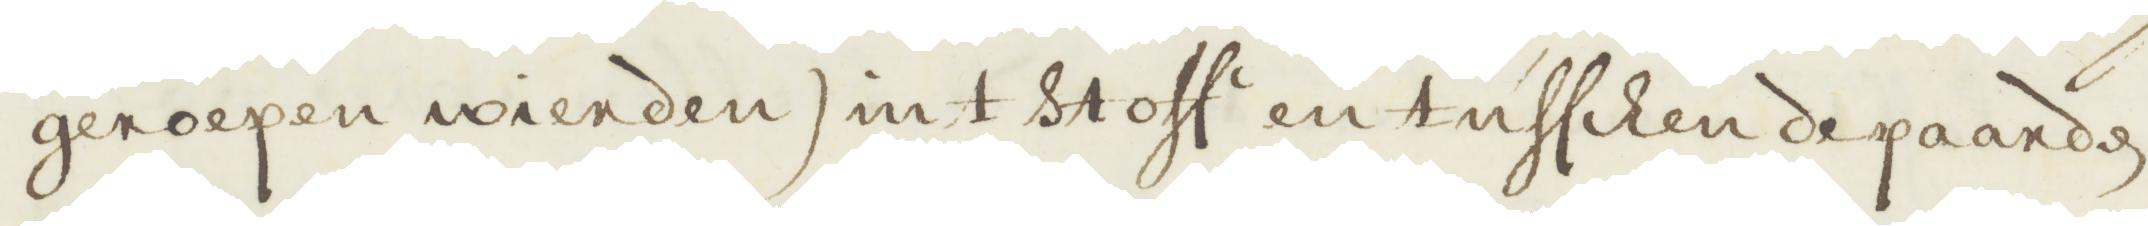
geroepen wierden) in t stoff en tusschen de paarden
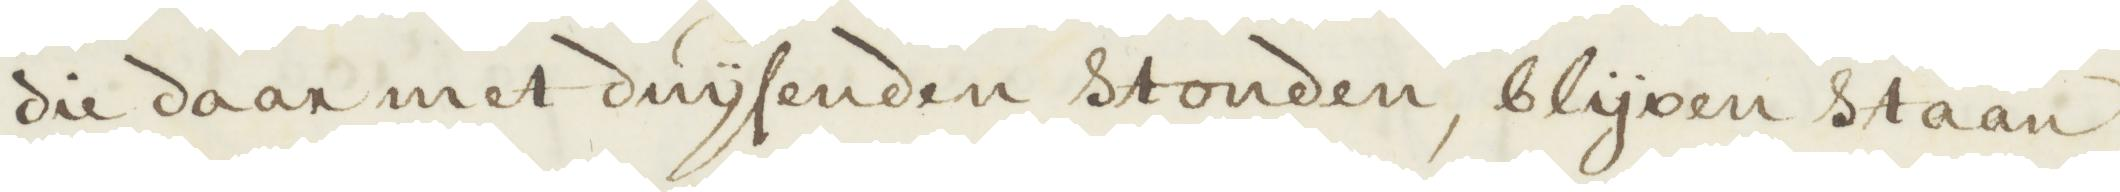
die daar met duijsenden stonden, blijven staan
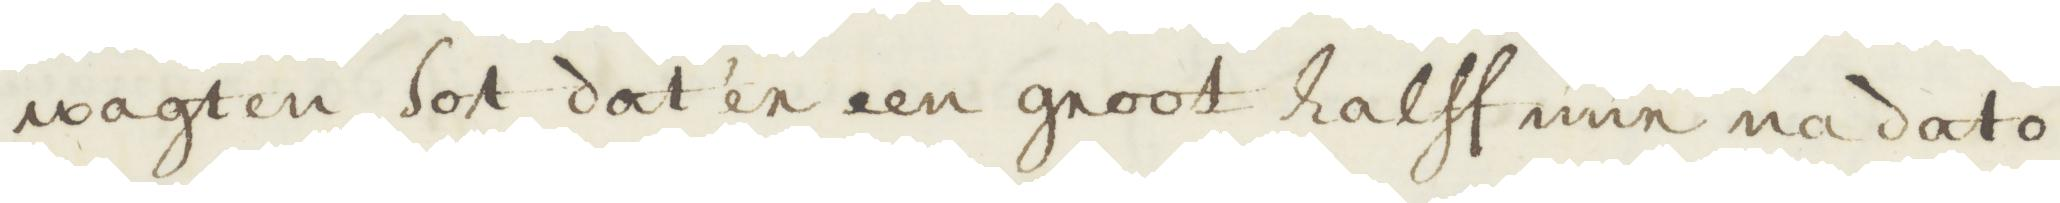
wagten, tot dat 'er een groot halff uur na dato
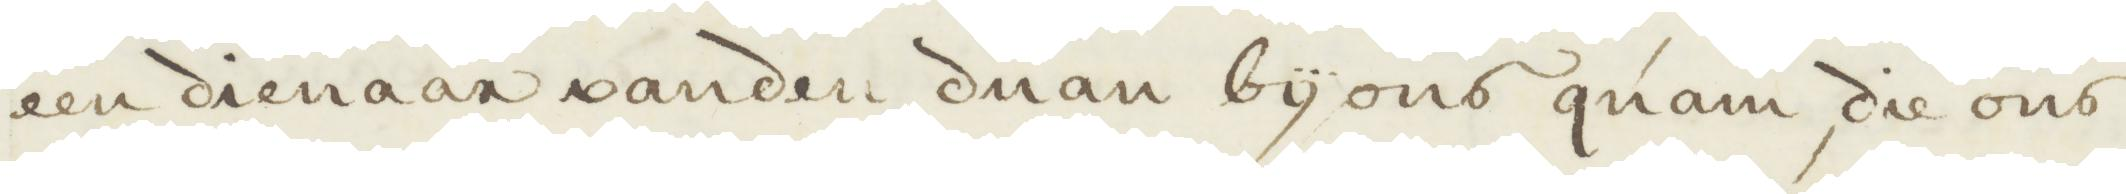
een dienaar vanden duan bij ons quam, die ons
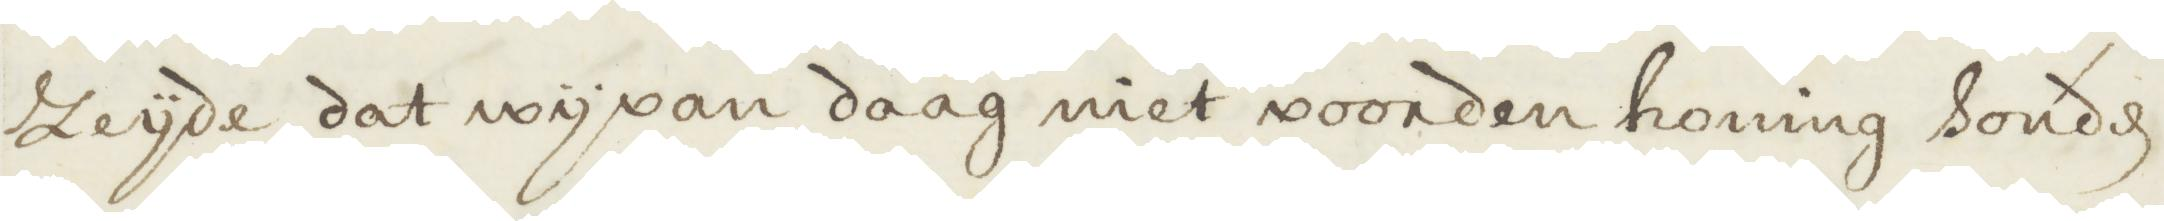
zeijde, dat wij van daag niet voorden koning souden
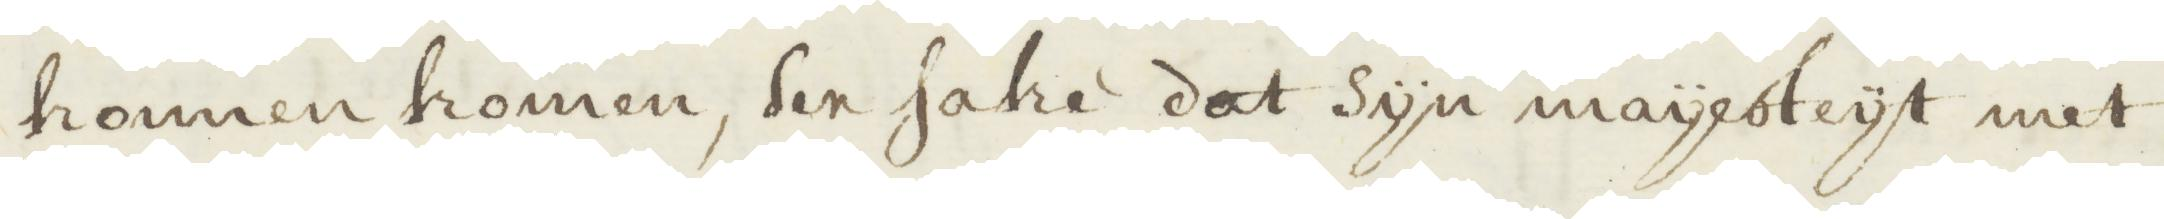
konnen komen, ter sake dat sijn maijesteijt met
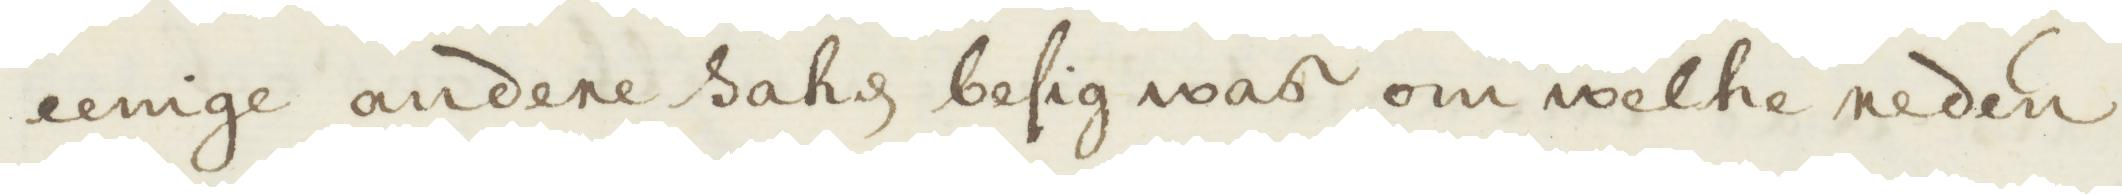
eenige andere saken besig was, om welke reden
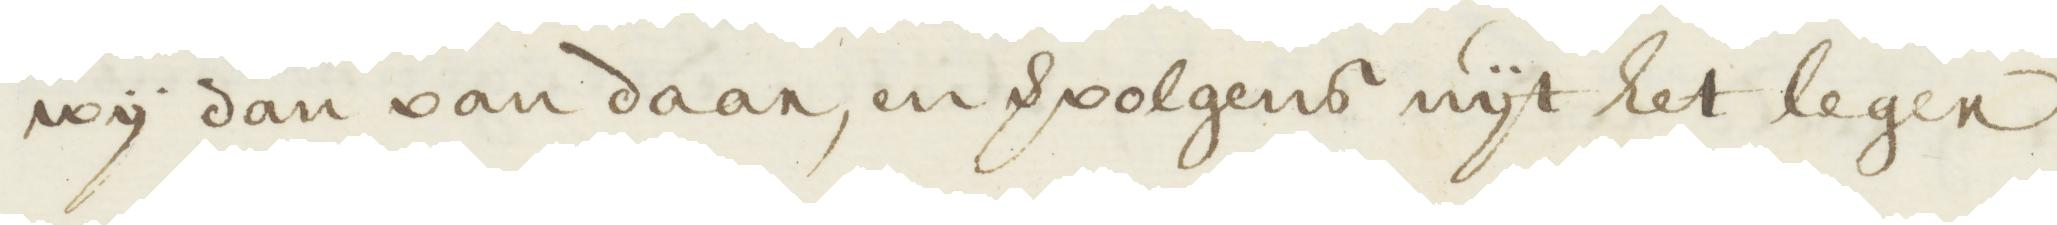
wij dan van daar, en vervolgens uijt het leger
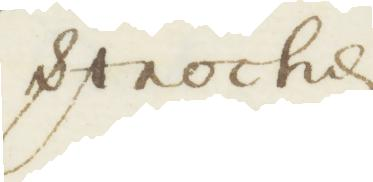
vertrocken
